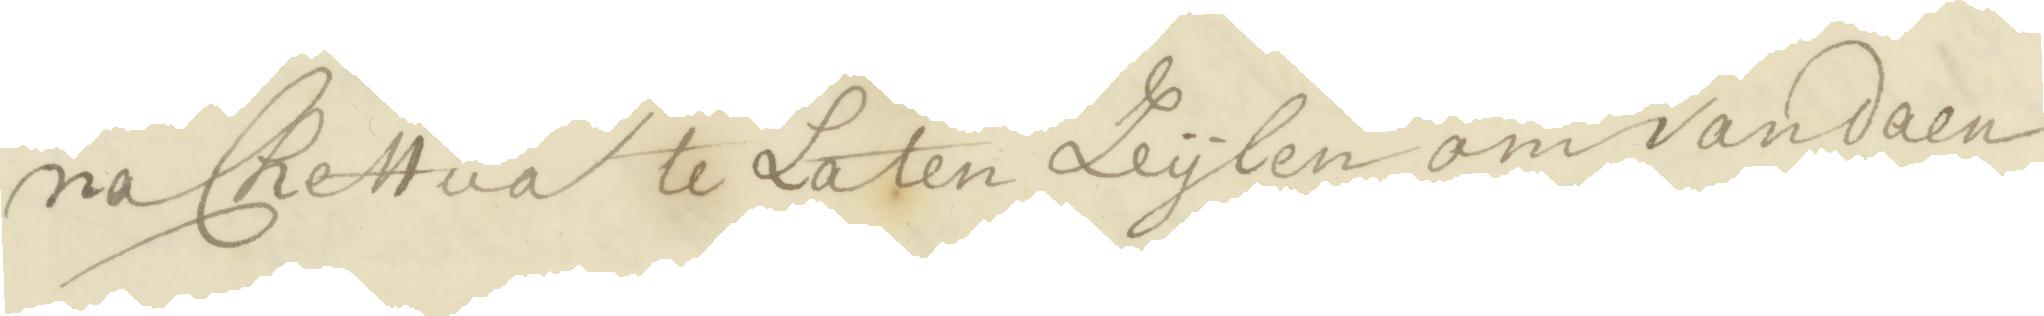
na Chettua te laten zeijlen om van daer
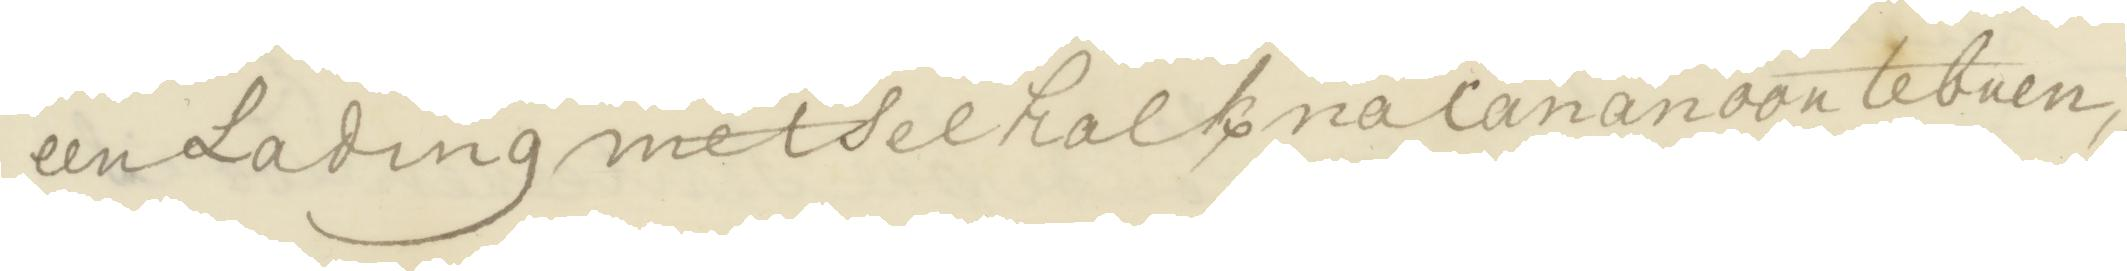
een Lading metselkalk na cananoor te bren„
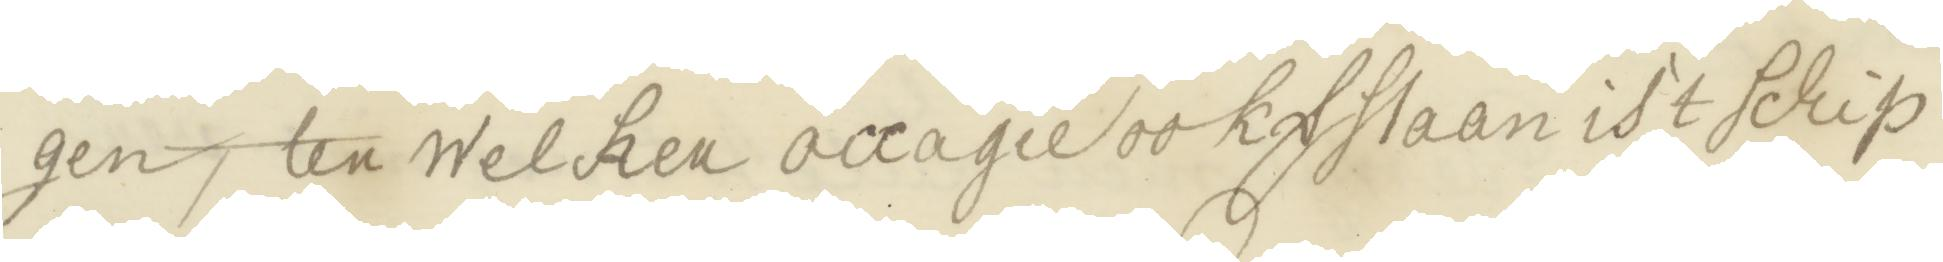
gen, ter welker occagie ook verstaan is ’t schip
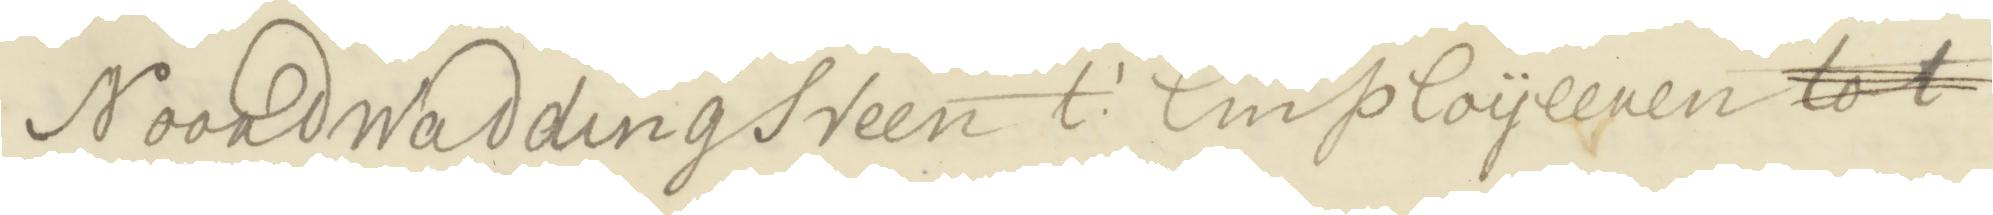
Noordwaddingsveen t' Emploijeeren tot
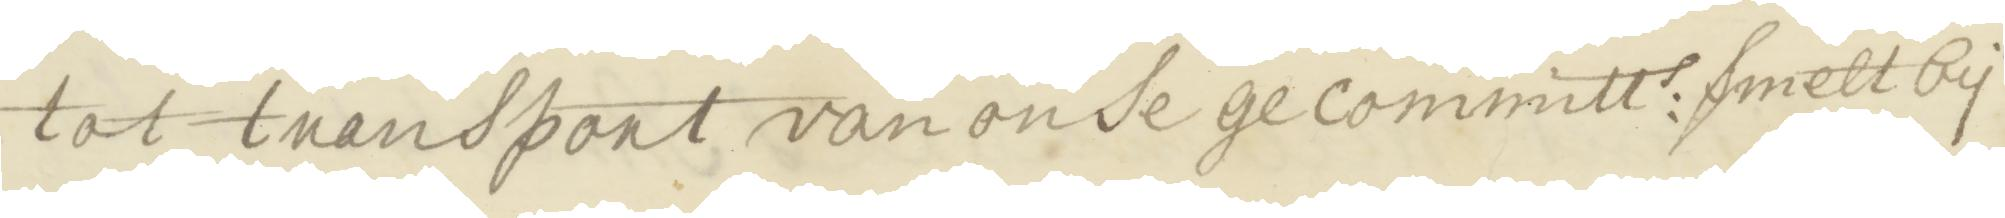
tot transport van onse gecommitt:s vermelt bij
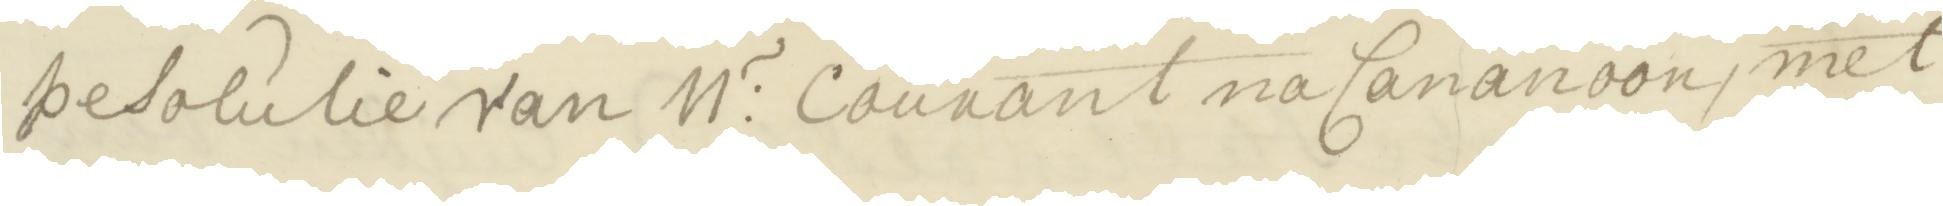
pesolutie van 11:' courant na Cananoon, met
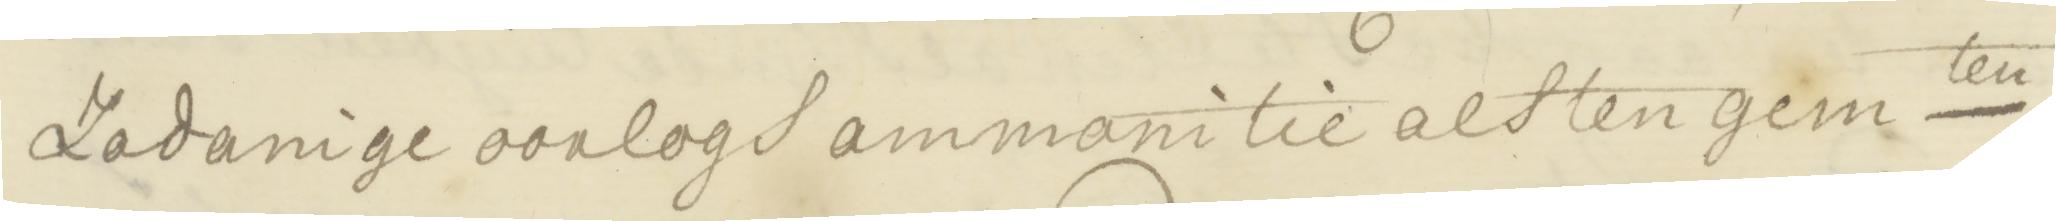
zodanige oorlogs ammonitie als ten gem_ten
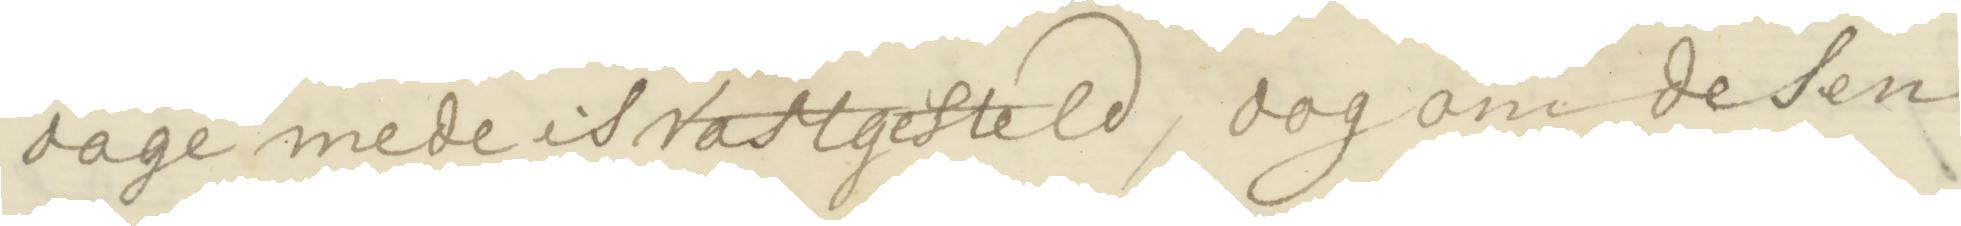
dage mede is vastgesteld, dog om desen
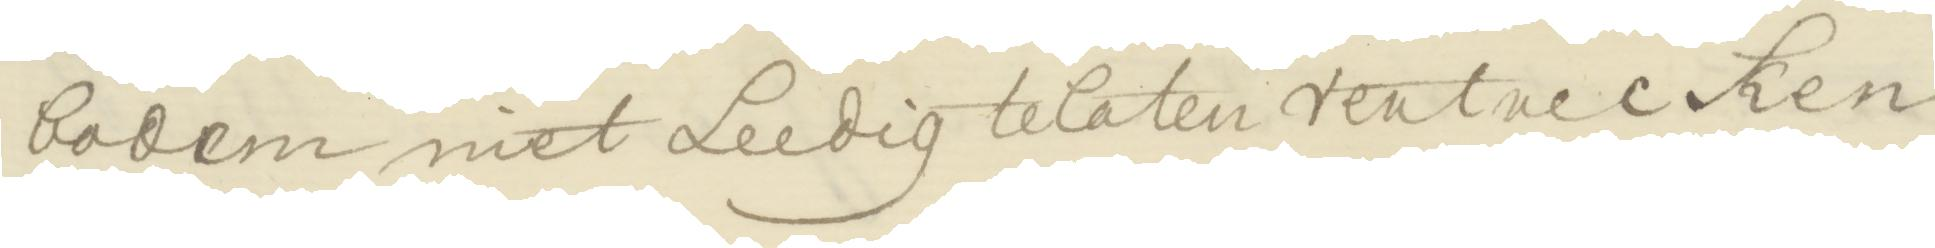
bodem niet Leedig te laten vertrecken
